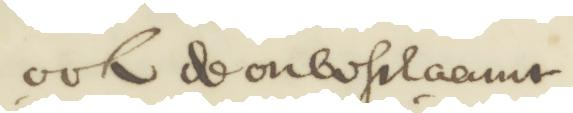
ook de onbeschaamt
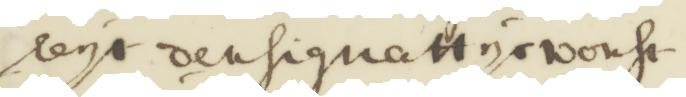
heijt der signattijs vorst
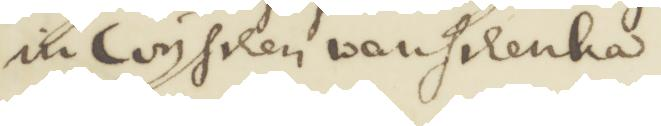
in t eijschen van schenka
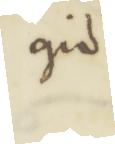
gie
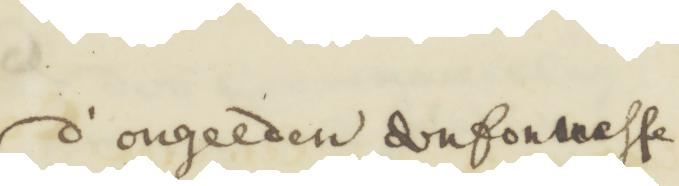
d’ ongelden der fortresse
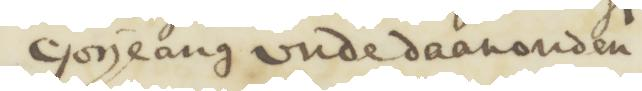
goijlang ende daaronder
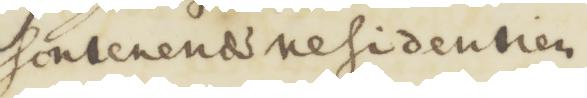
sorterende residentien
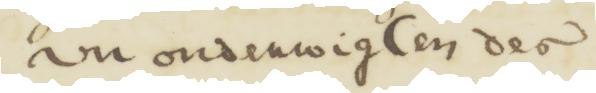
en onderwigten des
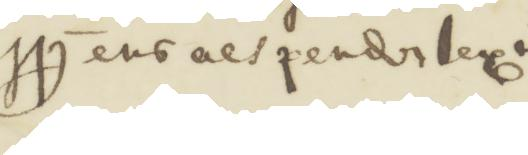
ppers als per den text
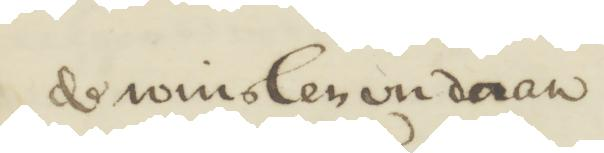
de winsten en daar
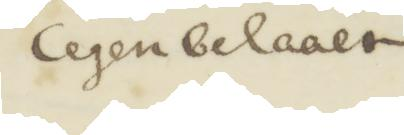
tegen behaalt
